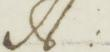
A:
